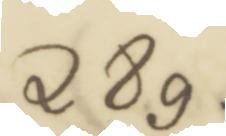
289.
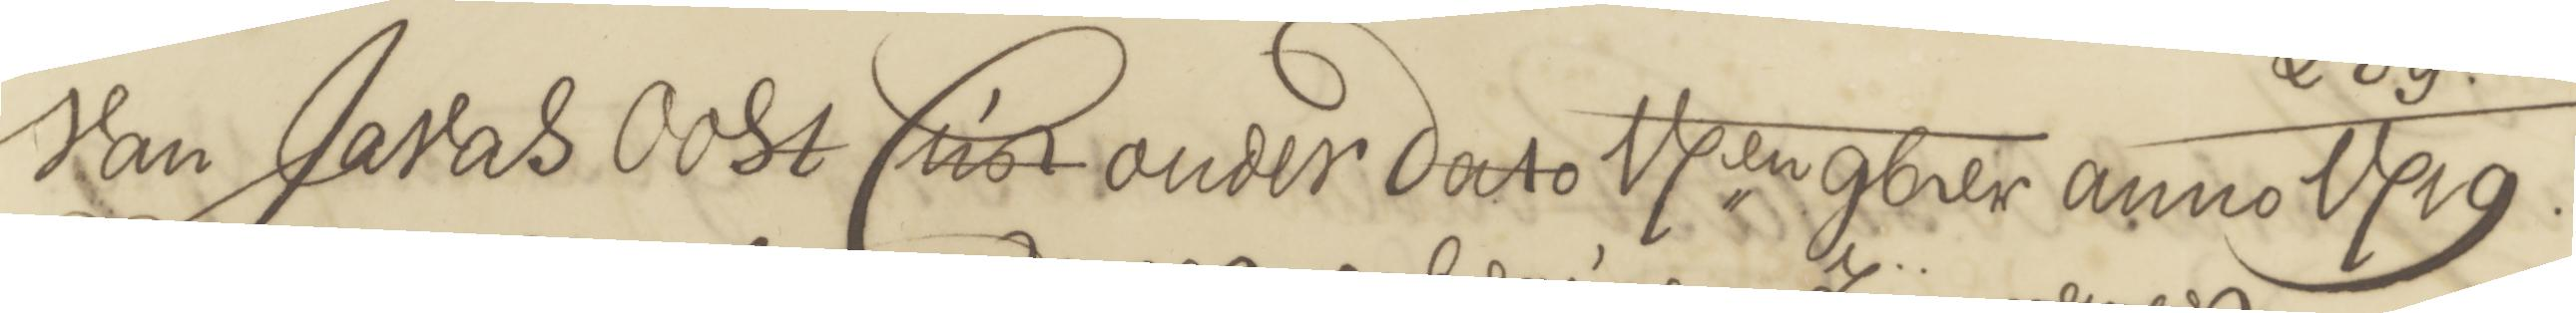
Van Javas Oost Cust onder dato 17„en 9ber anno 1719.
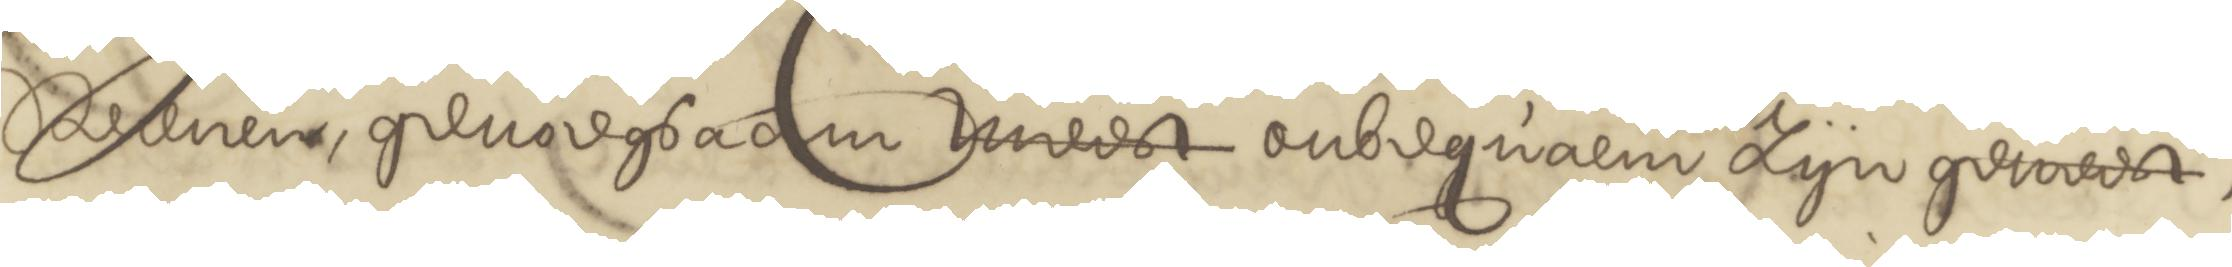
steenen, genoegsaam meest onbequaem zijn geweest,
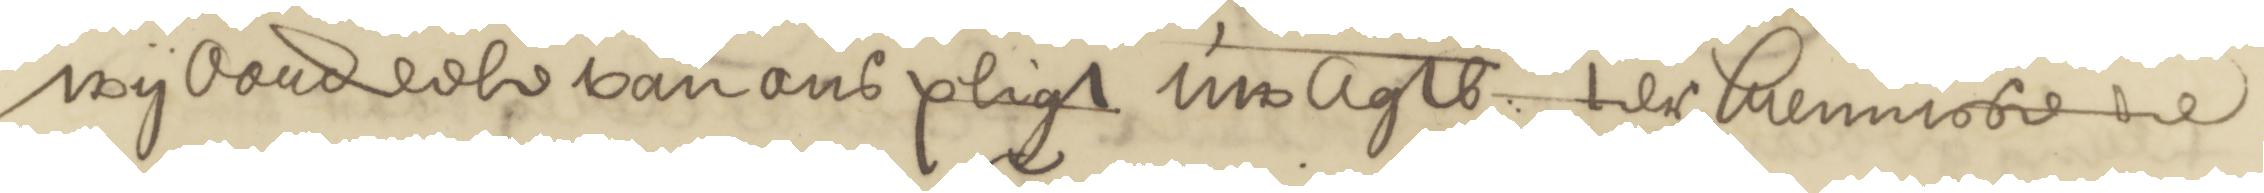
wij Oordeele van ons pligt uw Agtb: ter kennisse te
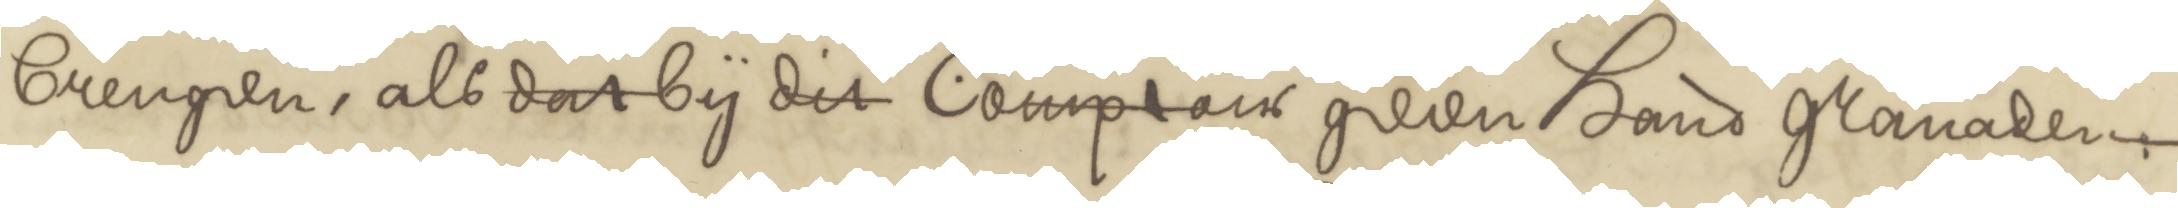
brengen, als dat bij dit Comptoir geen Hand granaden
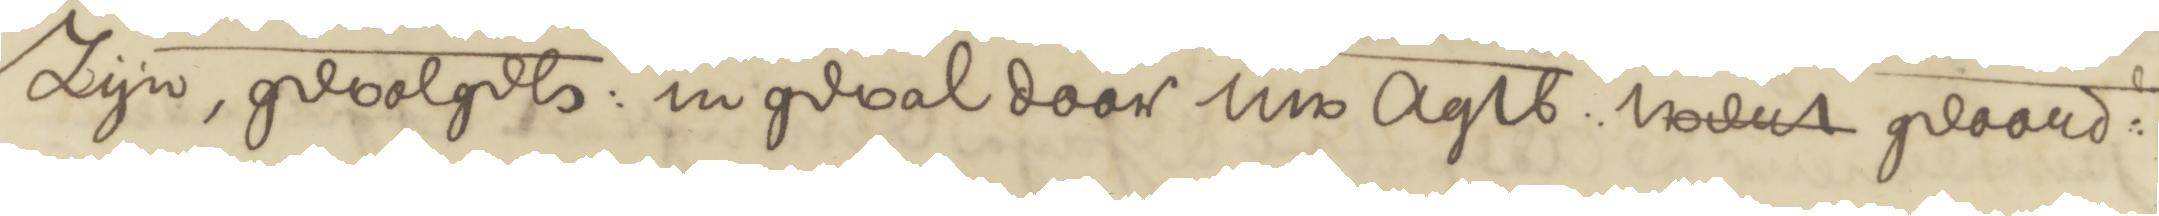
zijn, gevolgelijk: in geval door uw Agtb: wert geoord:
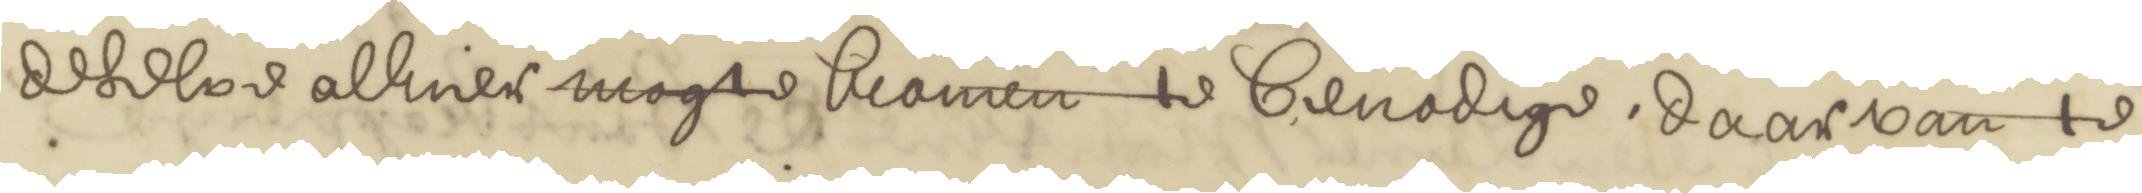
deselve alhier mogte komen te benodige, daar van te
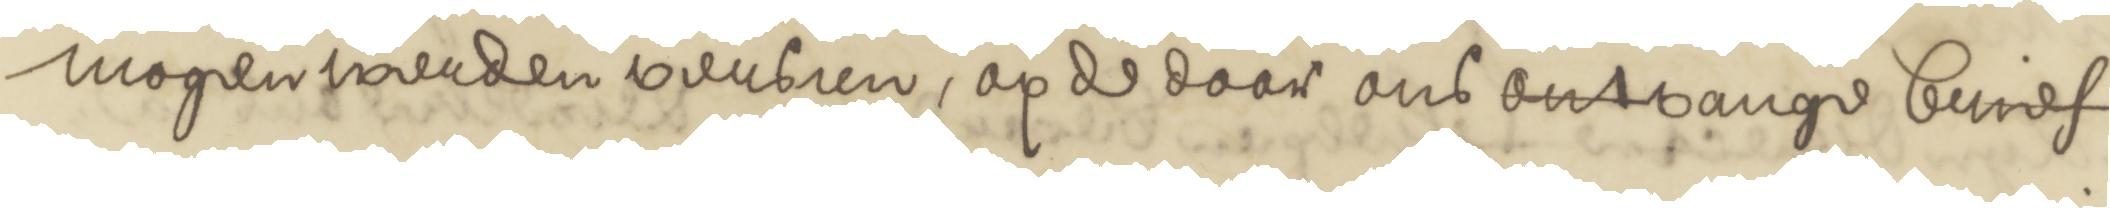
mogen werden versien, op de door ons ontvange brief
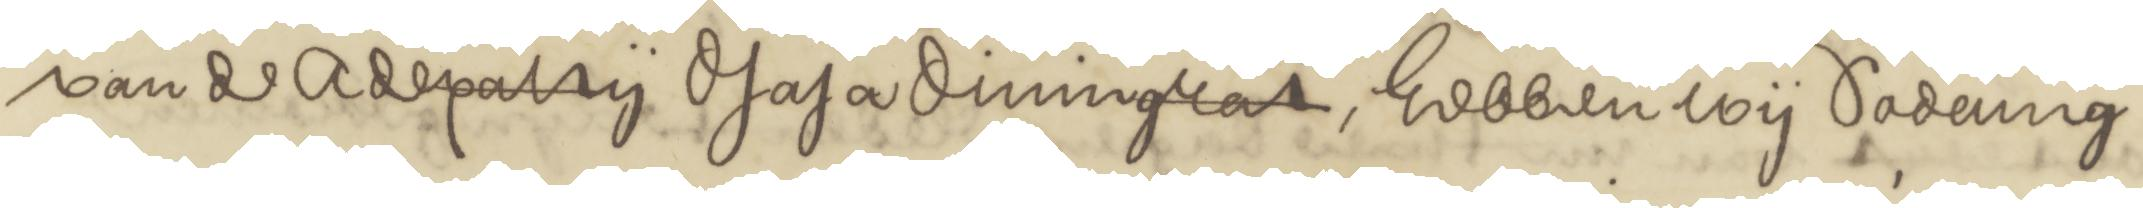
van de adepattij djaja diningrat, hebben wij sodanig
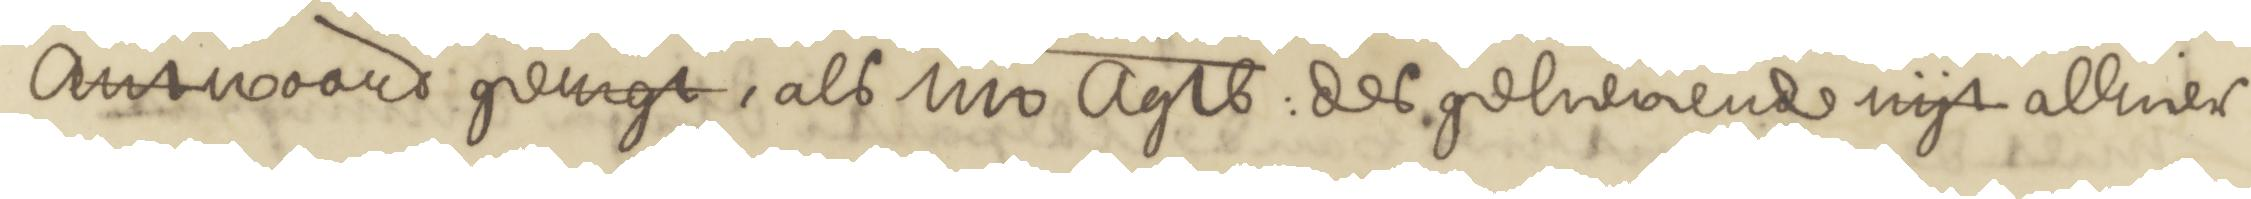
antwoord gerigt, als uw Agtb: des gelievende uijt alhier
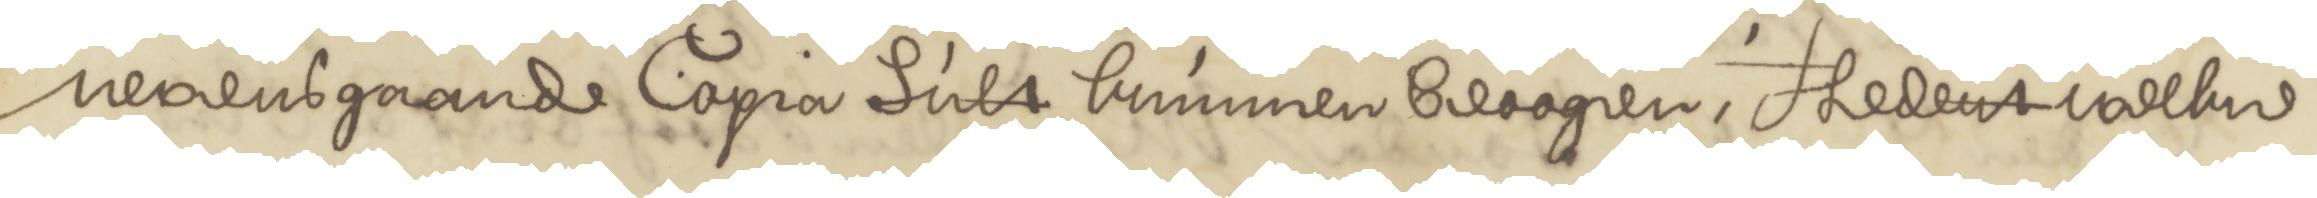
nevensgaande Copia sult kunnen beoogen, 'tsedert welke
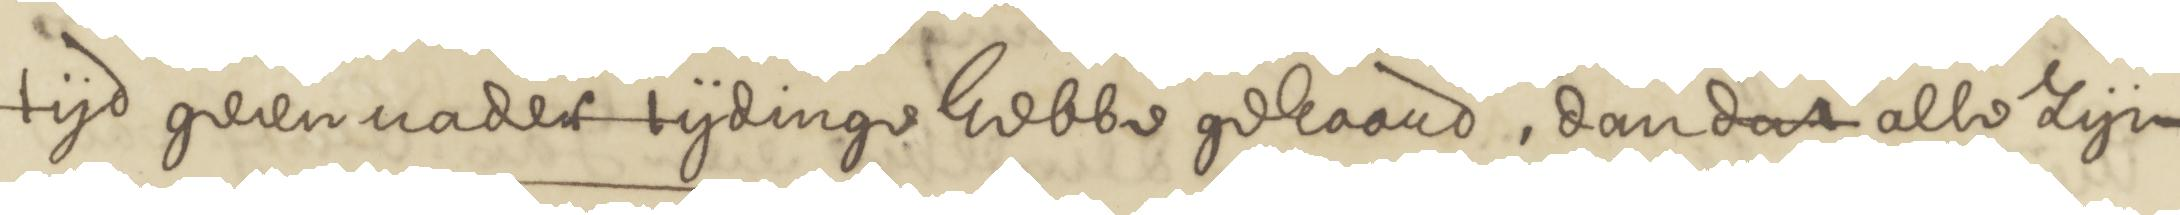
tijd geen nader tijdinge hebbe gehoord, dan dat alle zijn
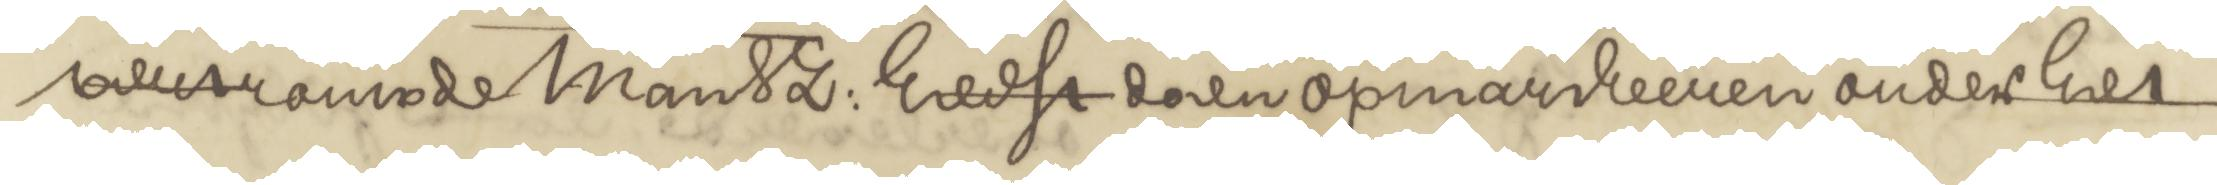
vertrouwde Mansz: heeft doen opmarcheeren onder het
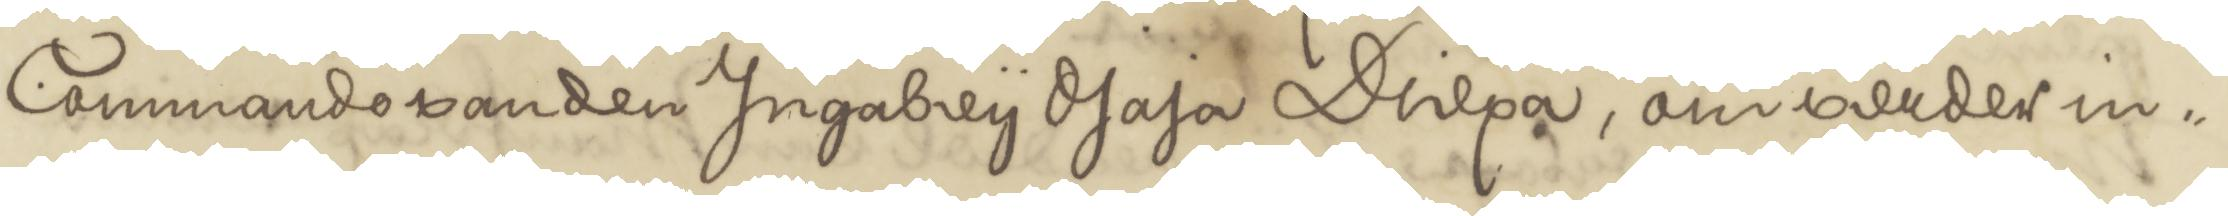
Commando van den Jngabeij djaja Diepa, om verder in„
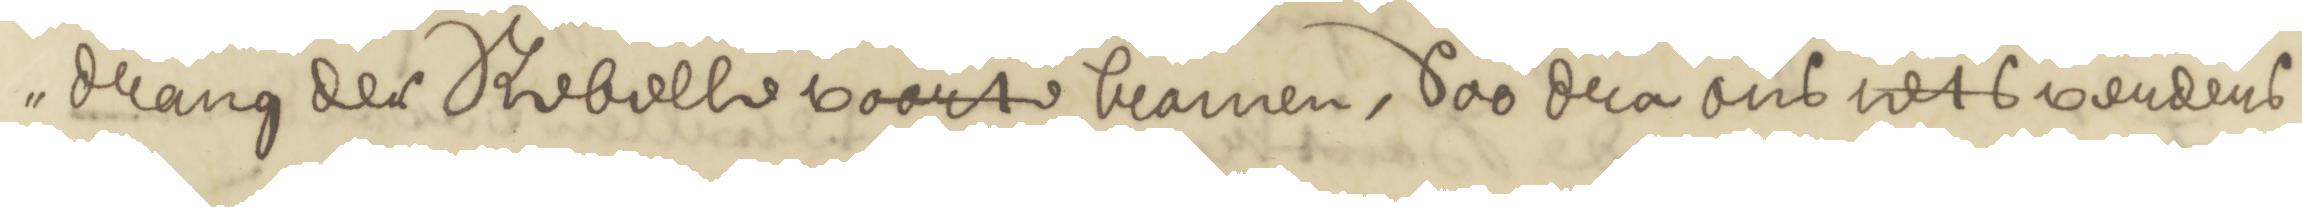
„drang der Rebelle voor te komen, soo dra ons iets verders
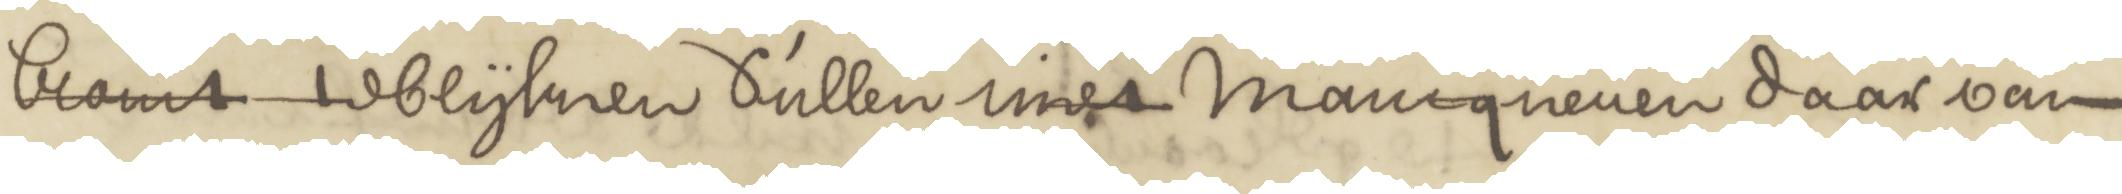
komt te blijken sullen niet mancqueren daar van
